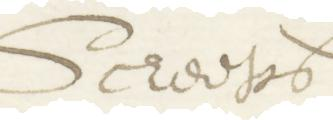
Scheeps
